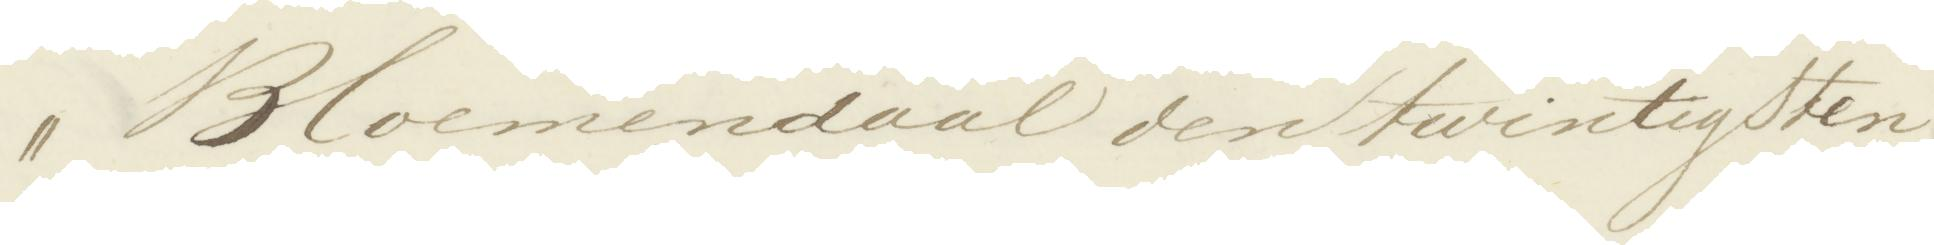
„ Bloemendaal den twintigsten
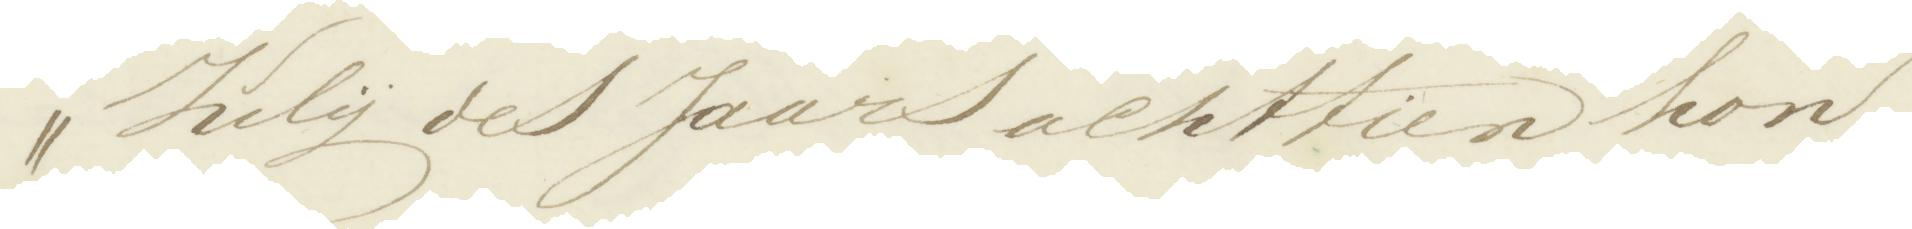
„ Iulij des Jaars achttien hon
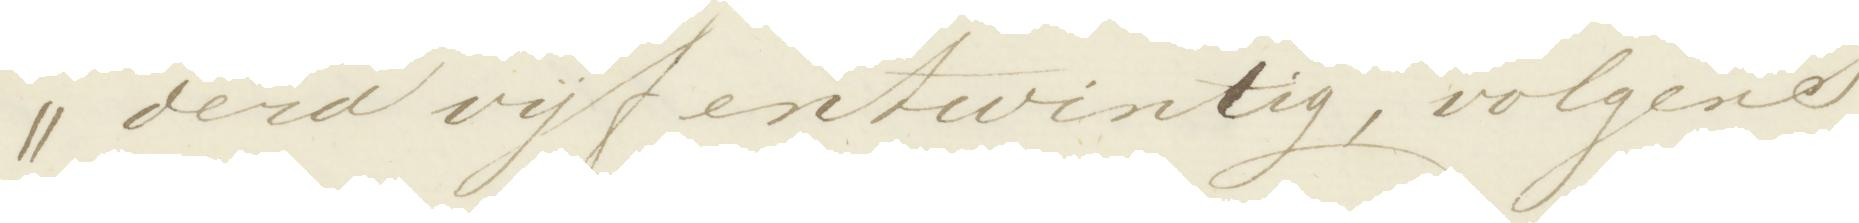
„ derd vijf entwintig, volgens
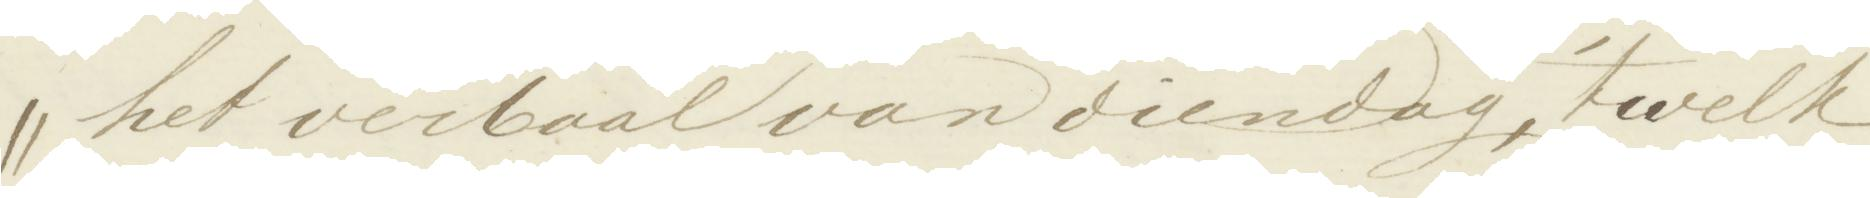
„ het verbaal van diendag, 'twelk
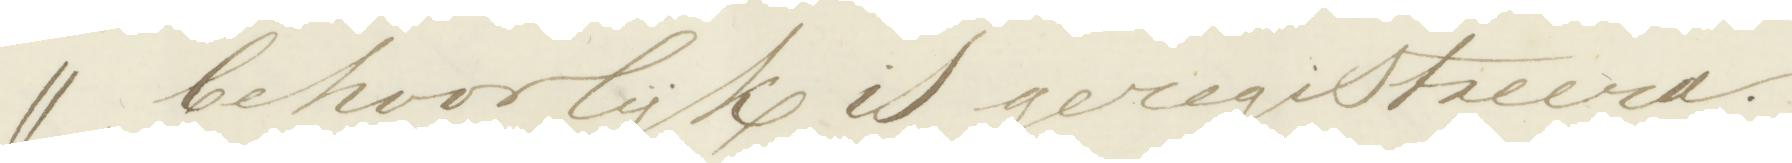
„ behoorlijk is geregistreerd.
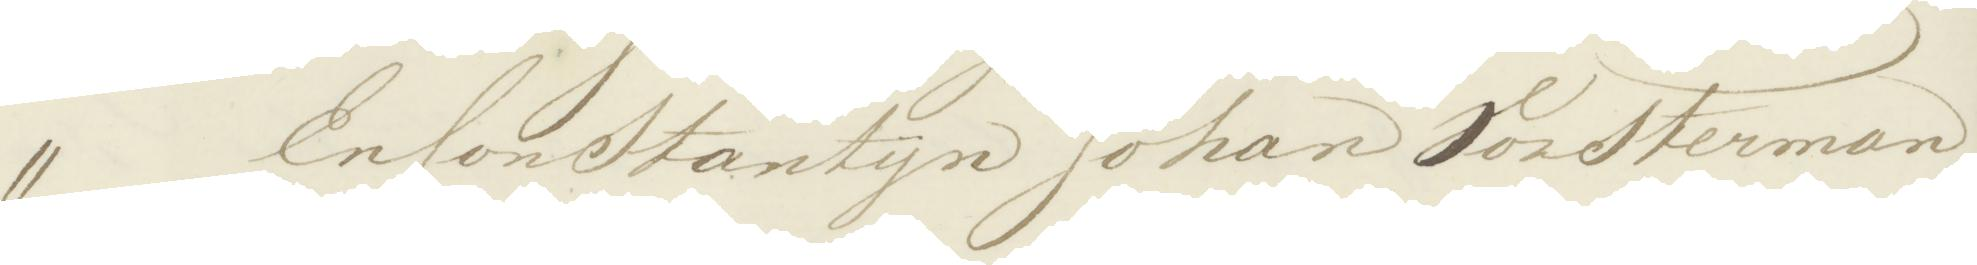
„ En Constantijn Johan Vorsterman
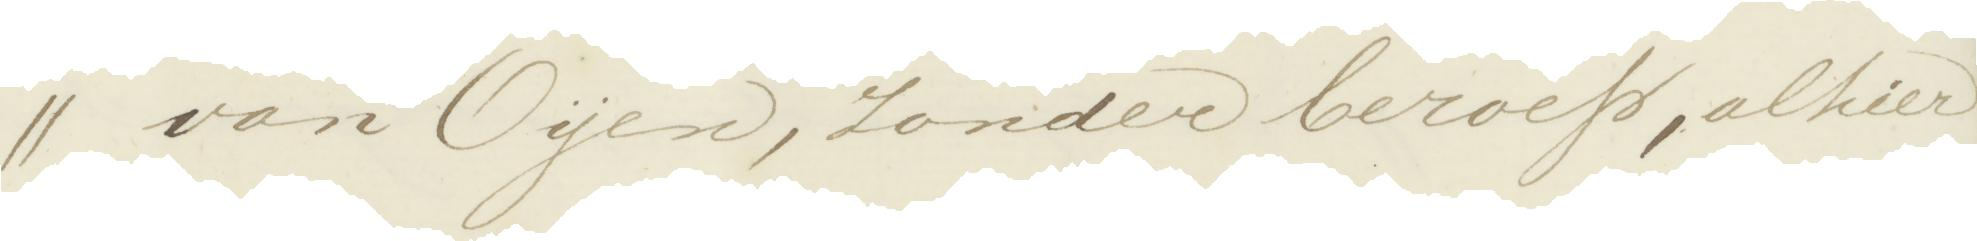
„ van Oijen, zonder beroep, alhier
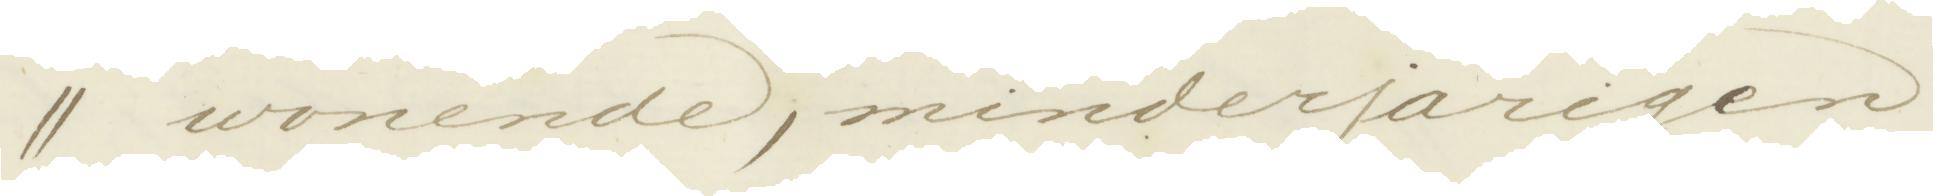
„ wonende, minderjarigen
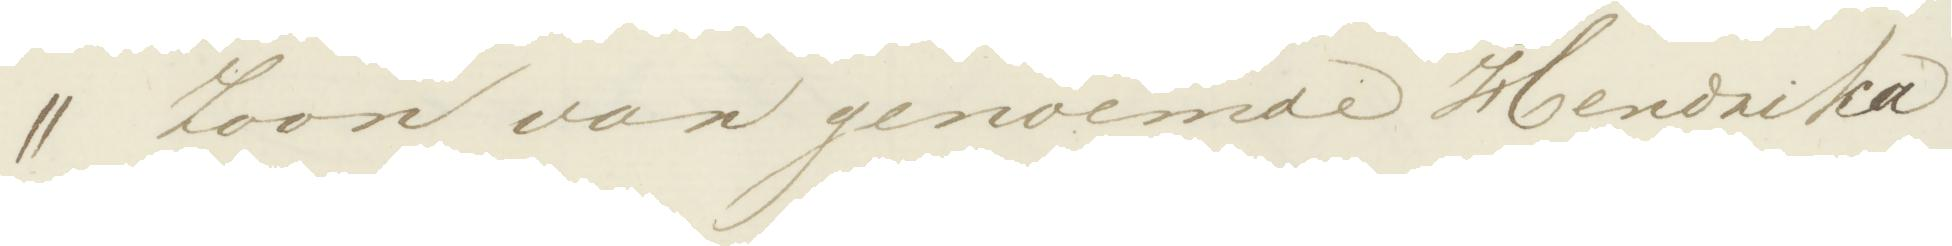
„ zoon van genoemde Hendrika
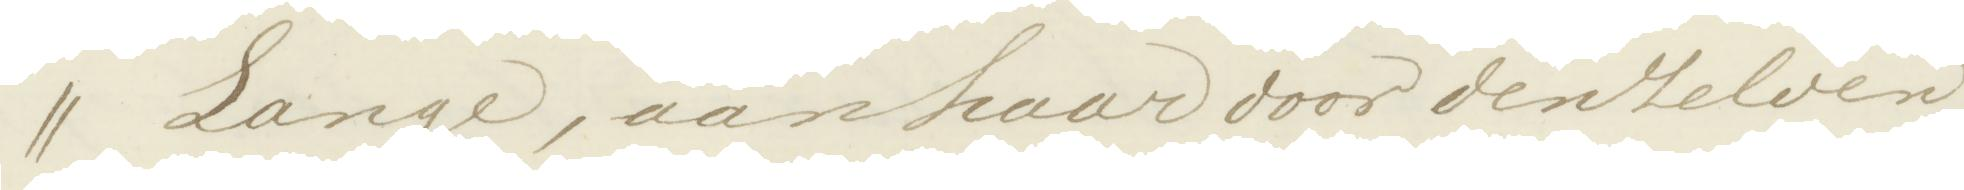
„ Lange, aanhaar door denzelven
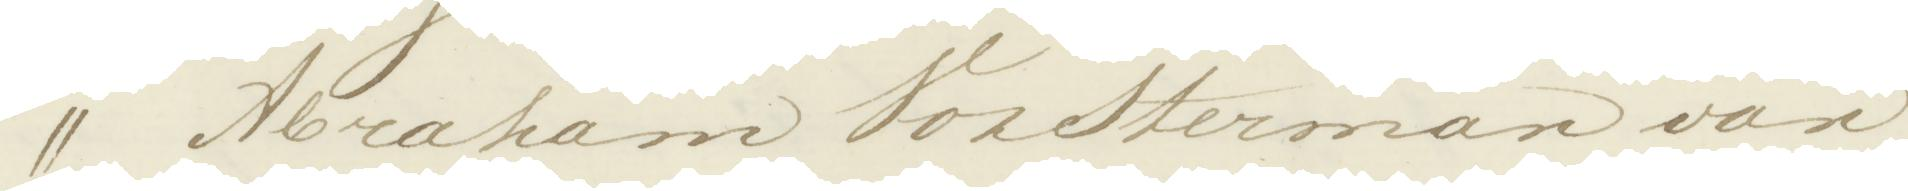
„ Abraham Vorsterman van
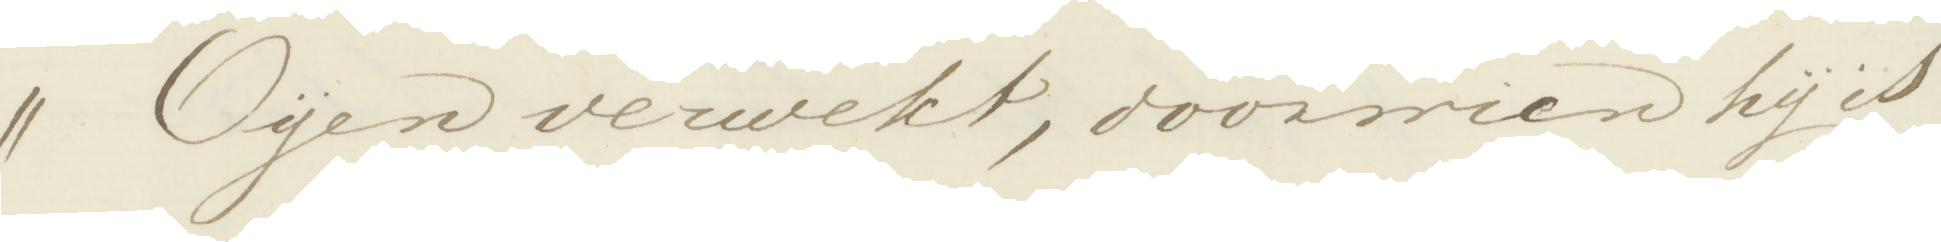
„ Oijen verwekt, doorwien hij is
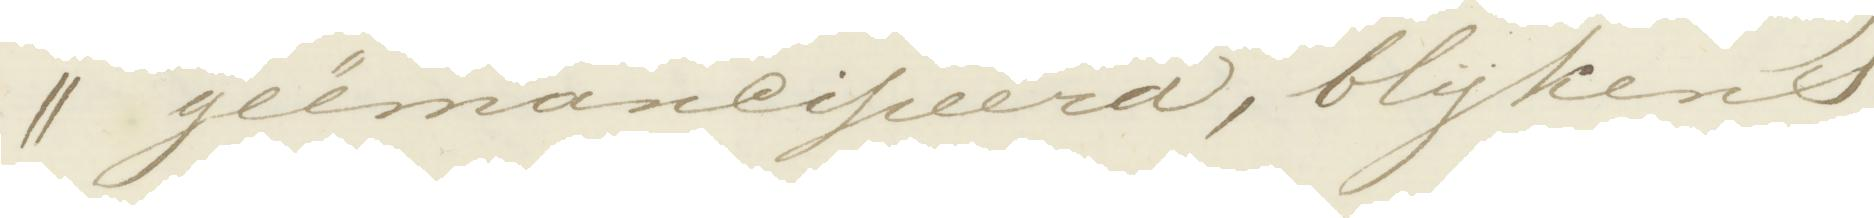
„ geëmancipeerd, blijkens
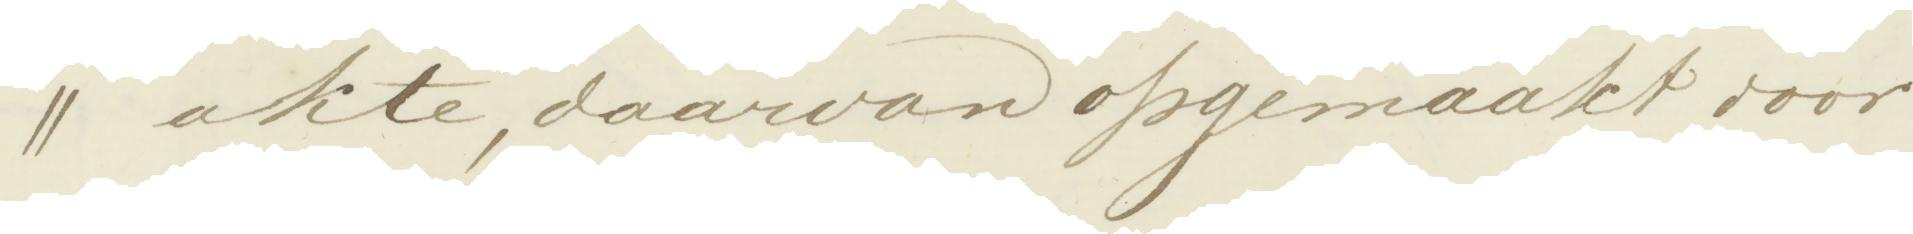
„ akte, daarvan opgemaakt voor
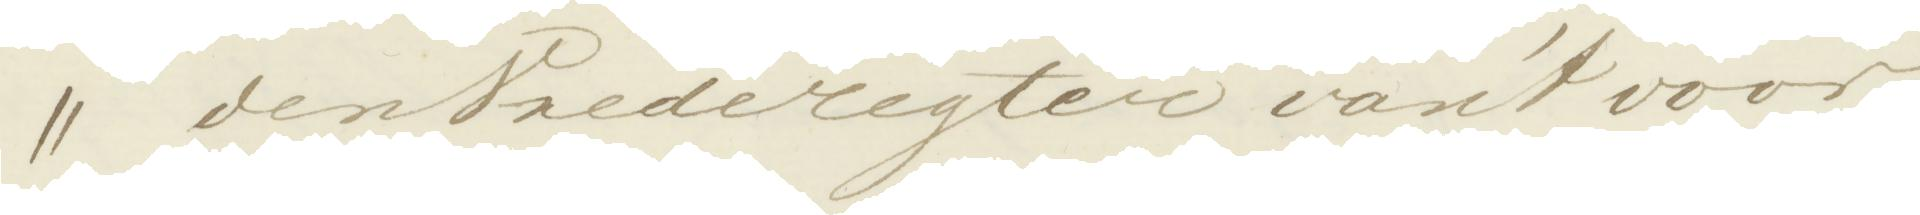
„ den Vrederegter van ’t voor
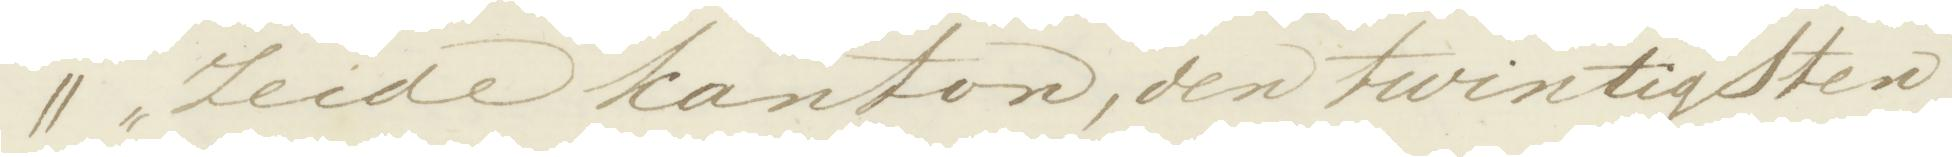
„ zeide kanton, den twintigsten
